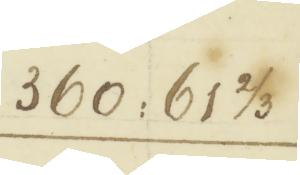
360:61 2/3
